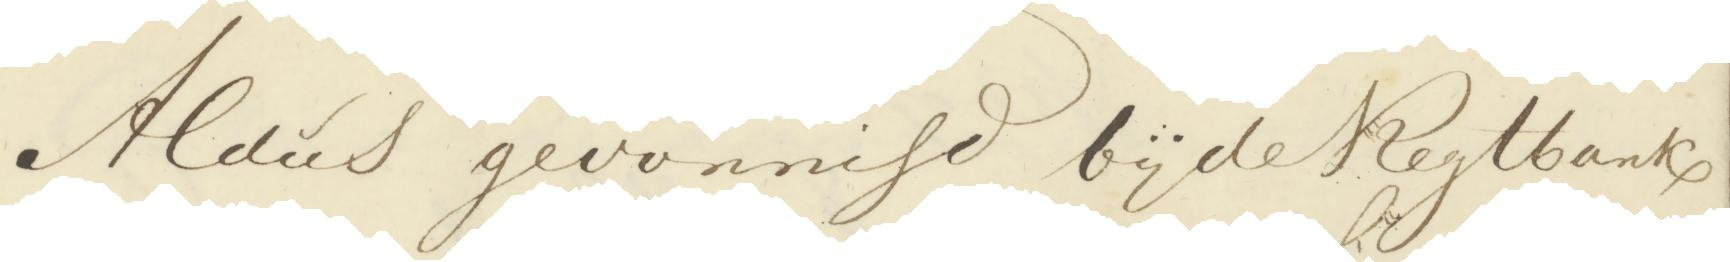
Aldus gevonnisd bij de Regtbank
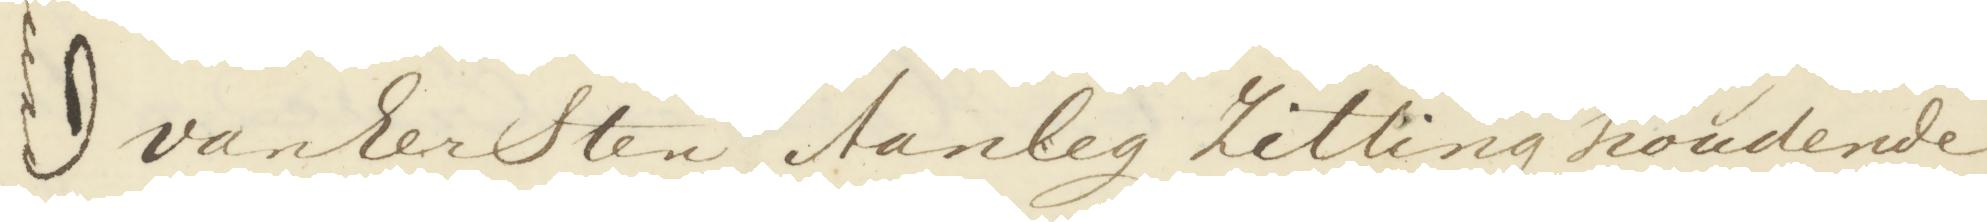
van Eersten Aanleg zitting houdende
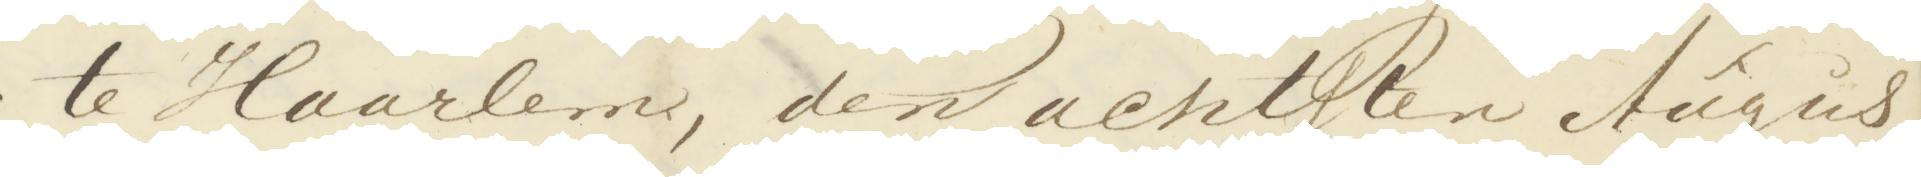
te Haarlem, den achtsten Augus
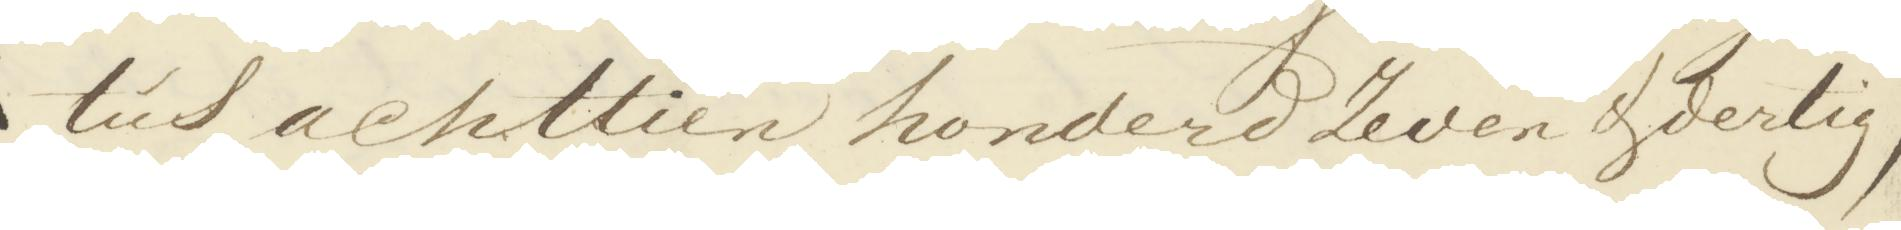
„tus achttien honderd zeven & dertig,
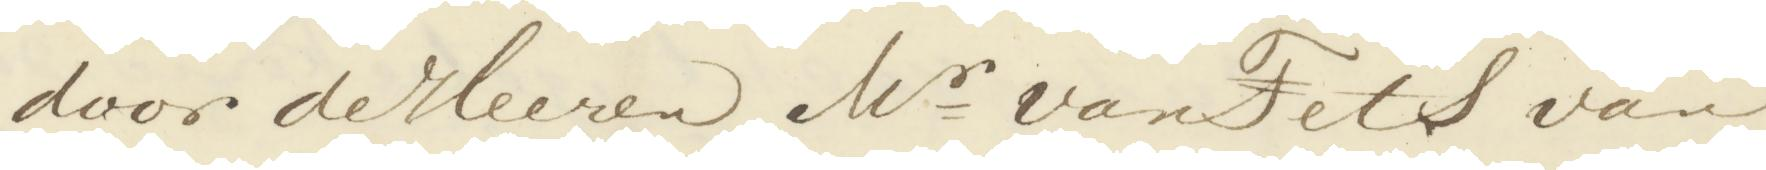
door de Heeren M=r van Tets van
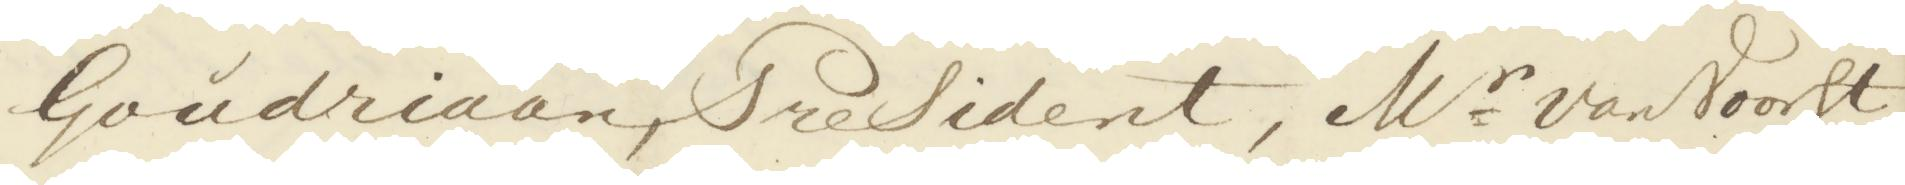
Goudriaan, President, M=r van Voorst,
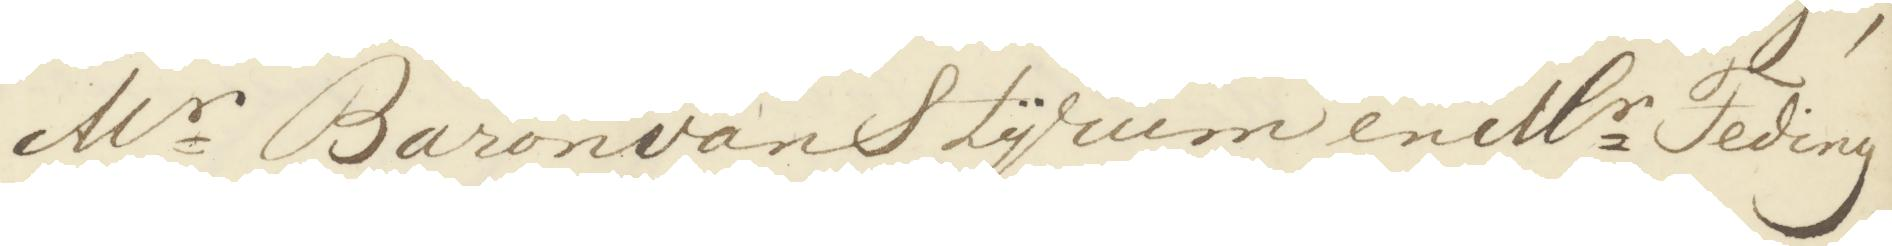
M=r Baron van Stijrum en M=r Teding
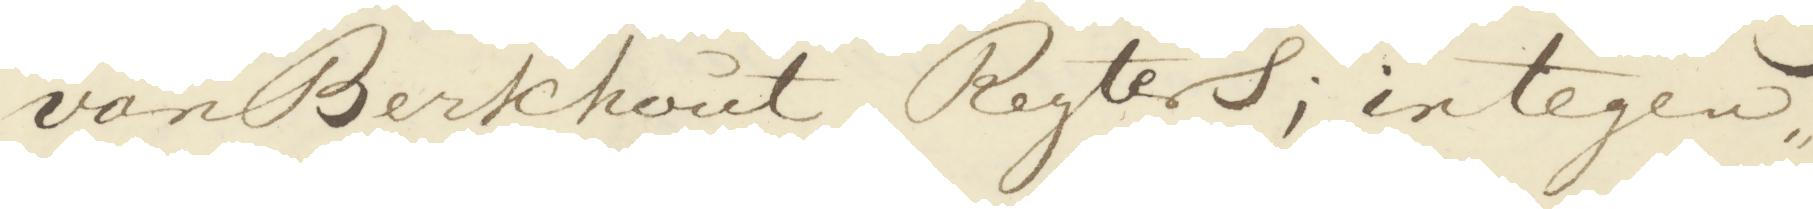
van Berkhout, Regters; in tegen„
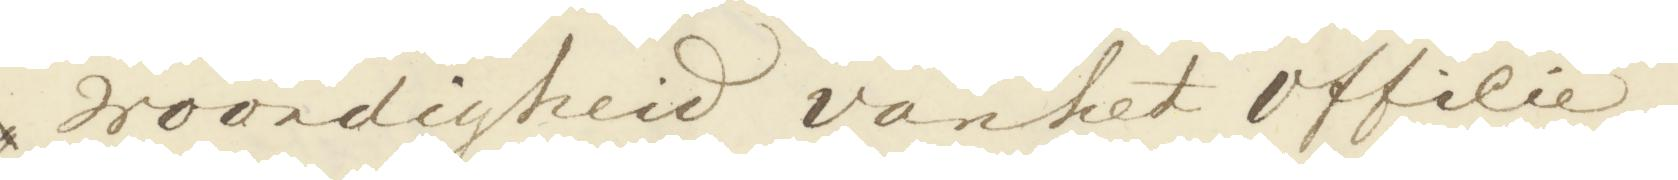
„woordigheid van het officie.
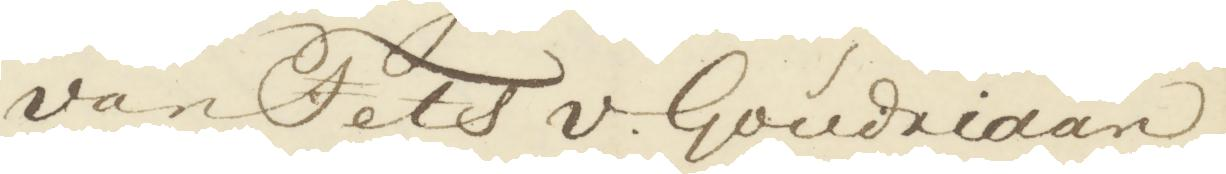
van Tets v. Goudriaan.
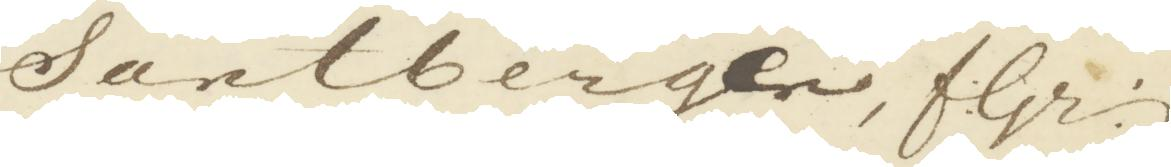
santbergen, f:Gr:
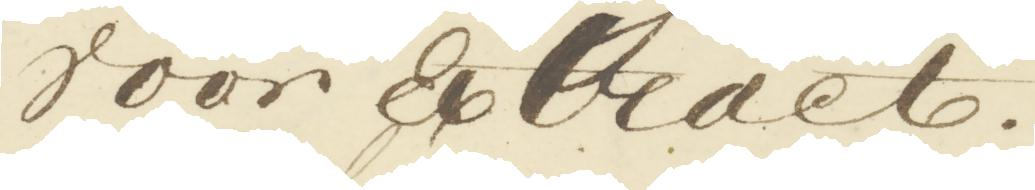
voor extract.
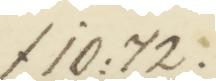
ƒ10:72.
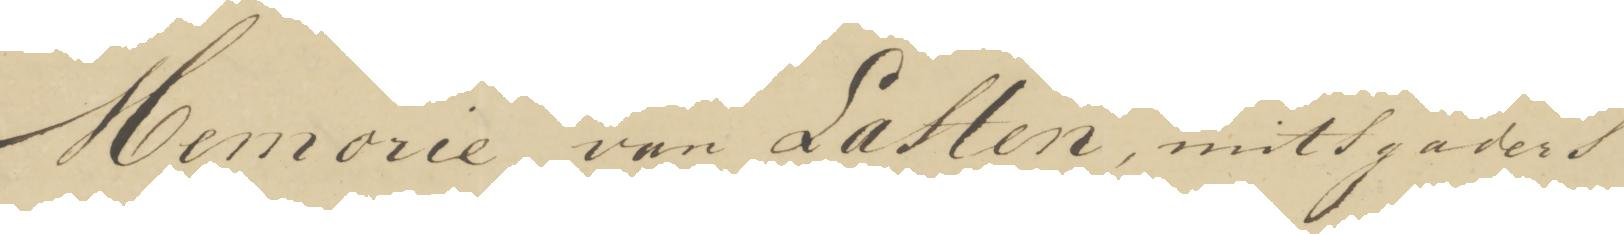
Memorie van Lasten, mitsgaders
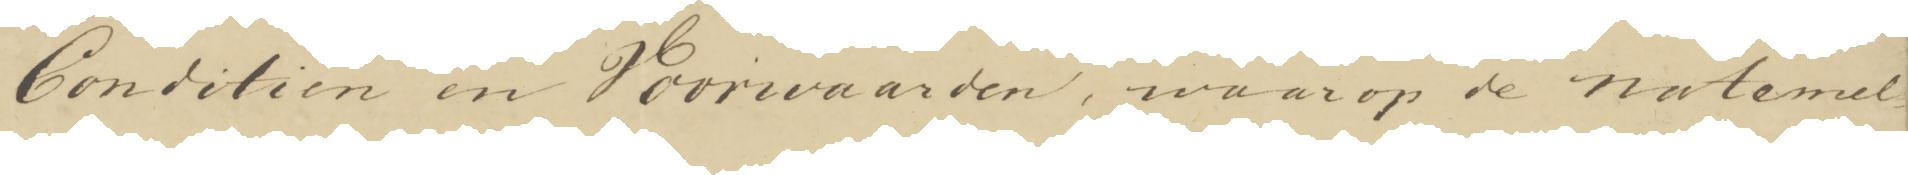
Conditien en Voorwaarden, waarop de natemel
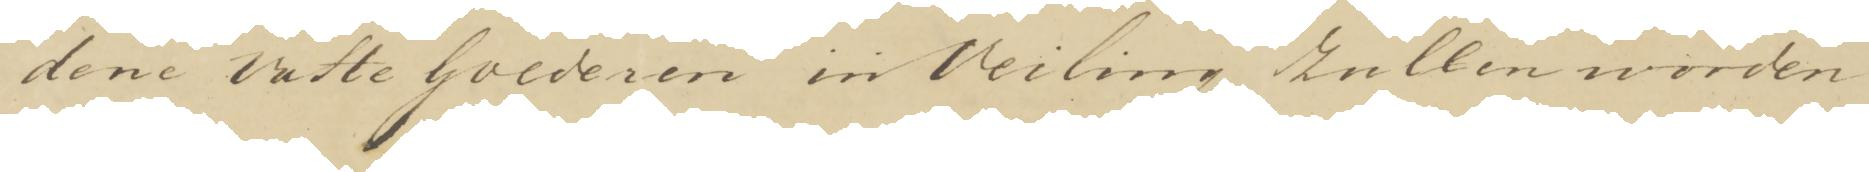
dene vaste Goederen in veiling zullen worden
